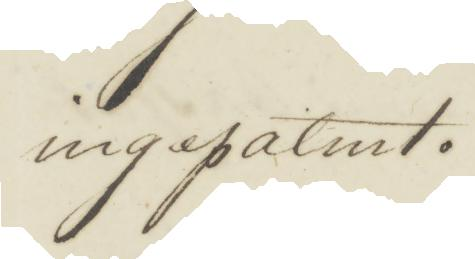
ingepalmt.
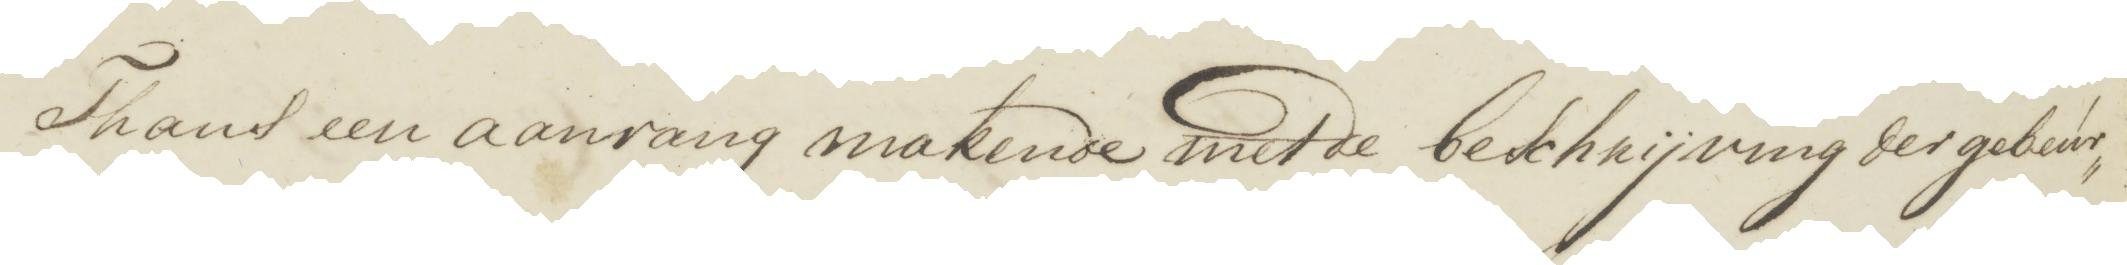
Thans een aanvang makende met de beschrijving der gebeur„
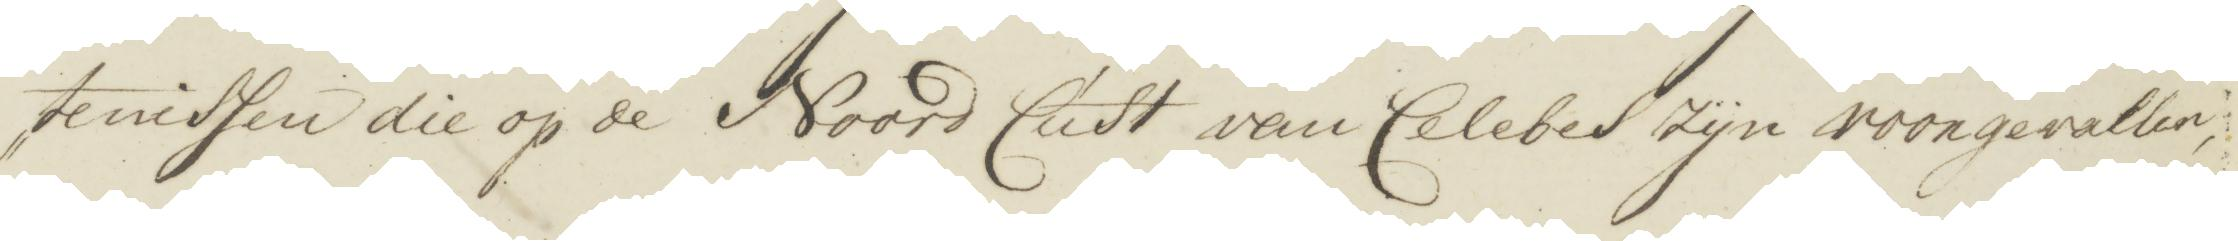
„tenissen die op de Noord Cust van Celebes zijn voorgevallen,
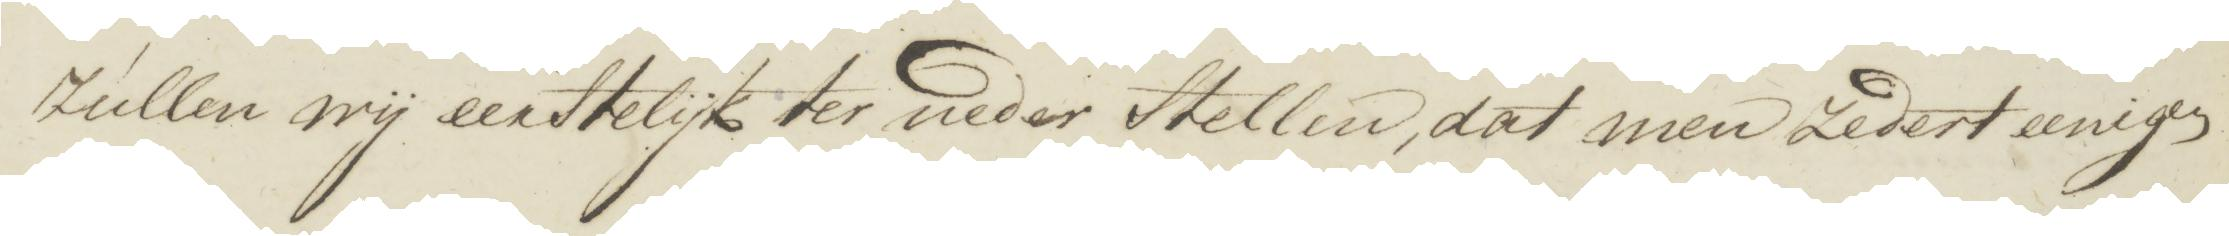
zullen wij eerstelijk ter neder stellen, dat men zedert eenigen
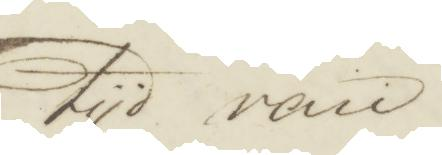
tijd van
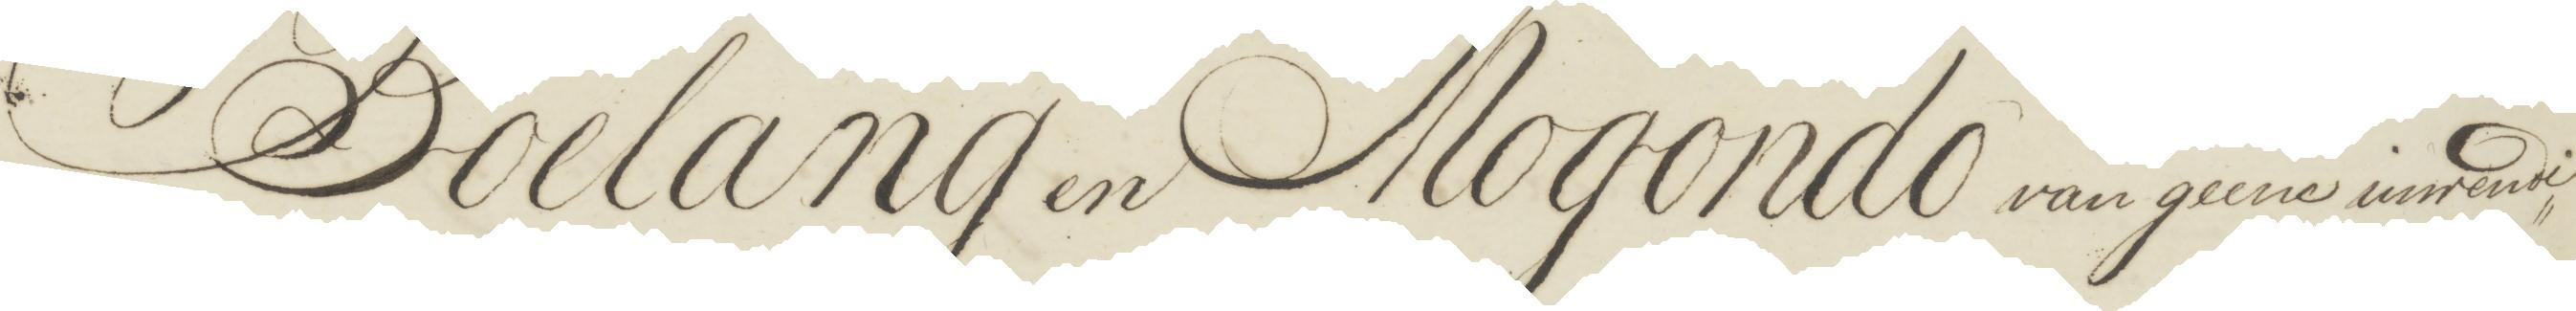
Boelang en Mogondo van geene inwendi„
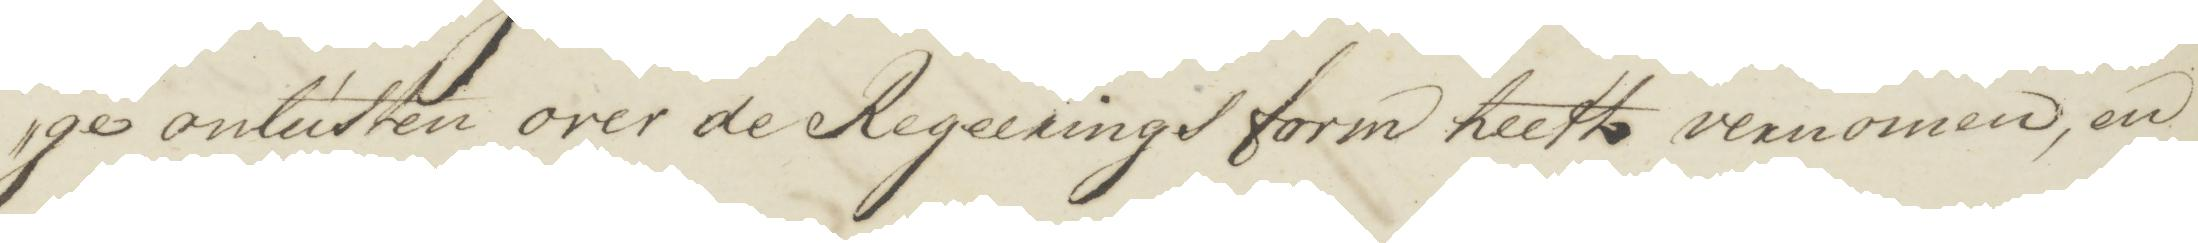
„ge onlusten over de Regeerings form heeft vernomen, en
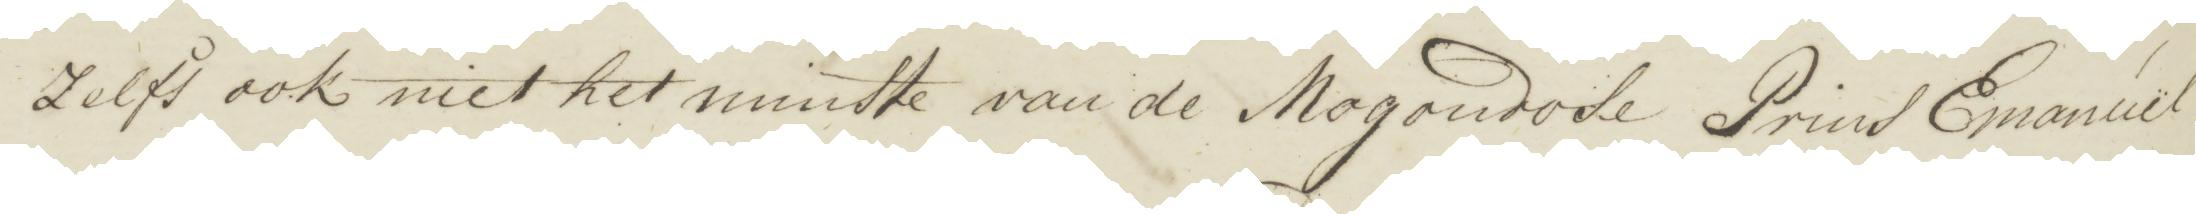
zelfs ook niet het minste van de Mogondose Prins Emanuël
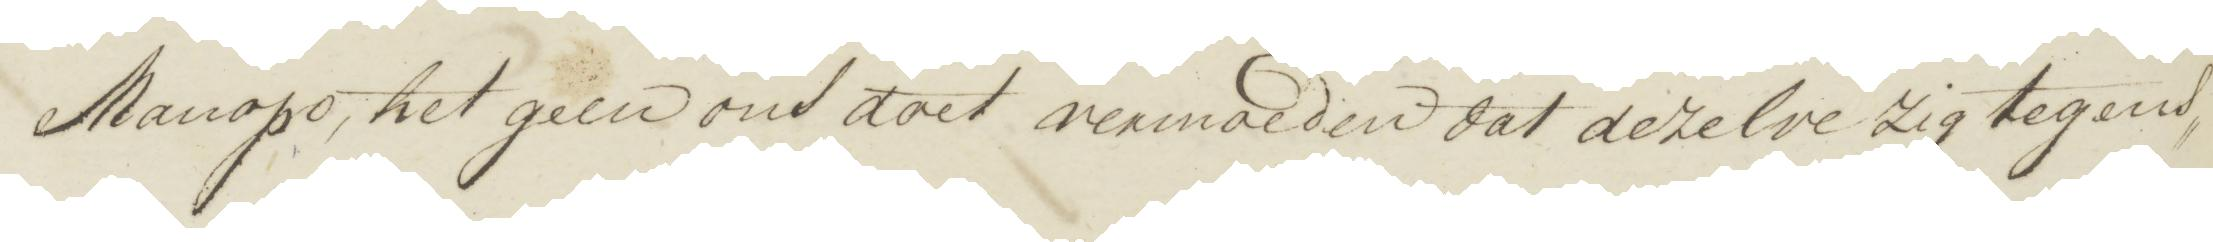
Manopo, het geen ons doet vermoeden dat dezelve zig tegens„
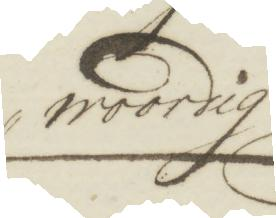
woordig
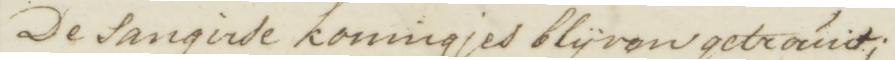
De sangirse koningjes blijven getrouw;
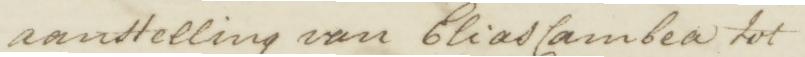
aanstelling van Elias Cambea tot
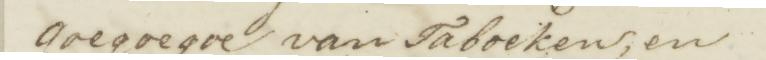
goegoegoe van Taboeken, en
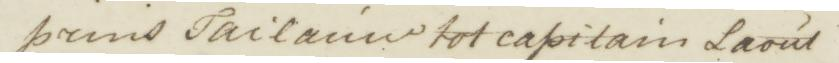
prins Tailauw tot capitain Laout
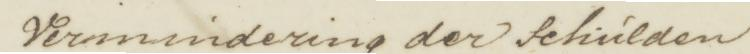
Vermindering der schulden
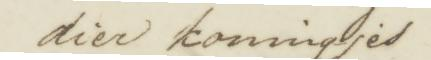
dier koningjes
